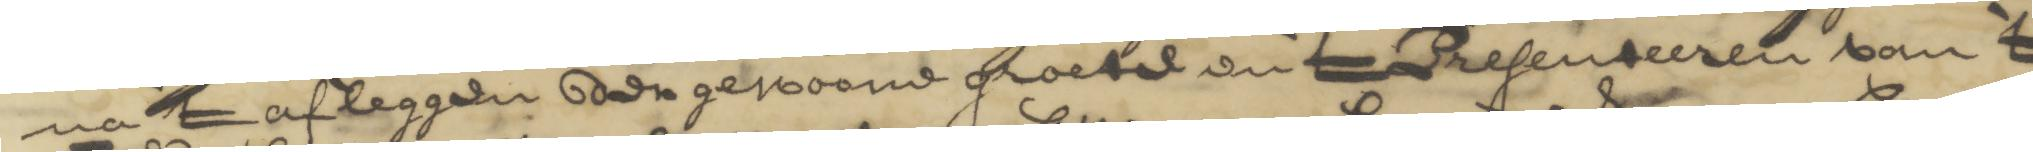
na ’t afleggen der gewoone groete en ’t Presenteeren van ’t
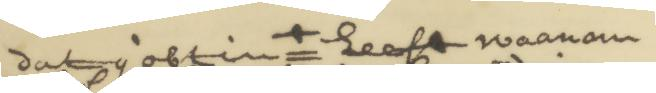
dat g'obtin=t heeft waarom
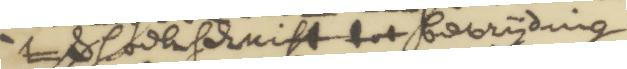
’t versoekschrift tot bevrijding
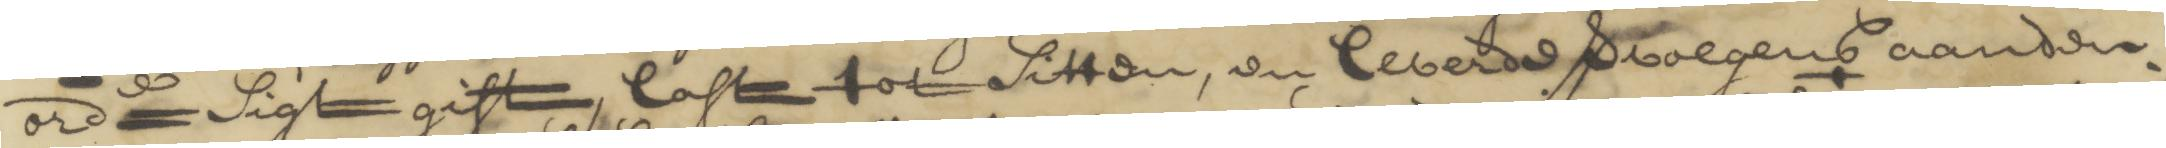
ord=e sigt gist, last tot sitten, en leverde vervolgens aanden
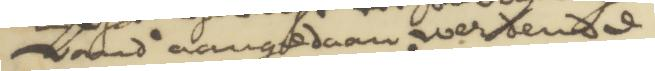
von d'aangedaan werdende
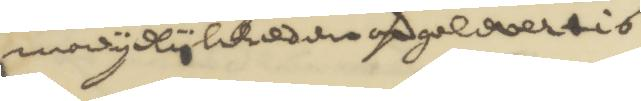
moeijelijkheden overgelevert is
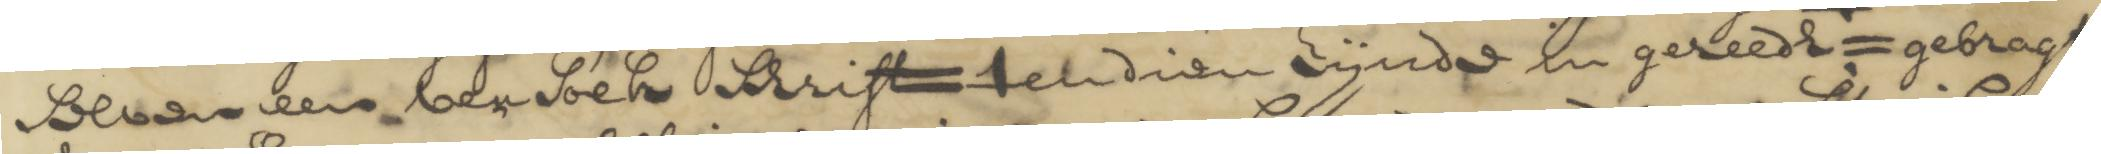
selven een versoek schrift ten dien Eijnde in gereedh=t gebragt
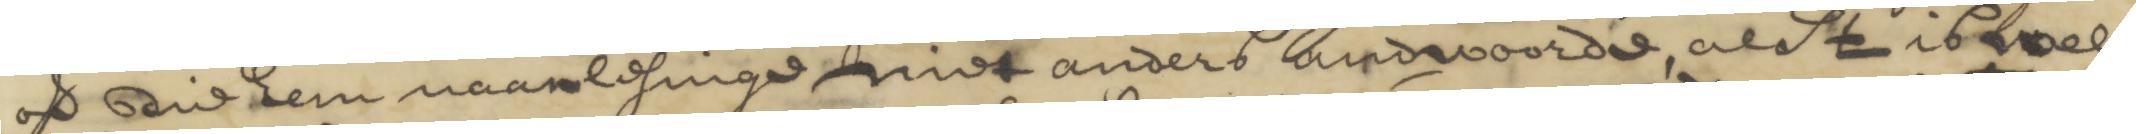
over die hem naarlesinge niet anders andwoorde als't is wel,
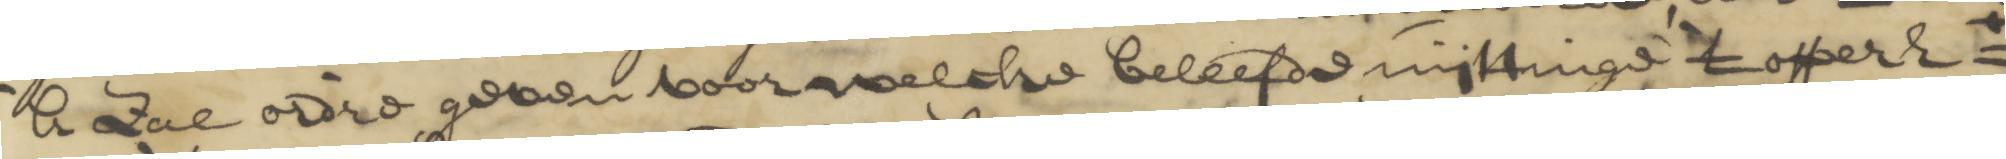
'k zal ordre geven voor welcke beleefde uijttinge ’t opperh=t
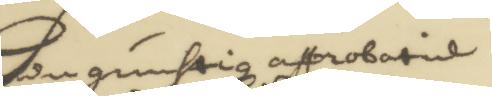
daar op Een gunstig approbatie
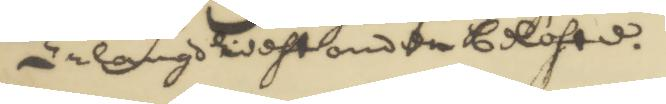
Erlangd heeft onder belofte
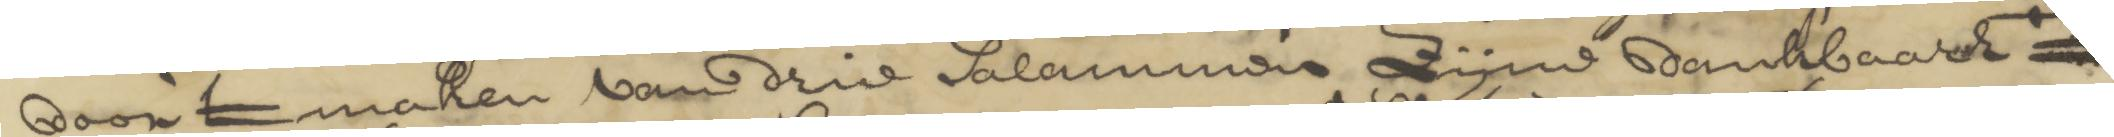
door 't maken van drie salammen zijne dankbaarh=t
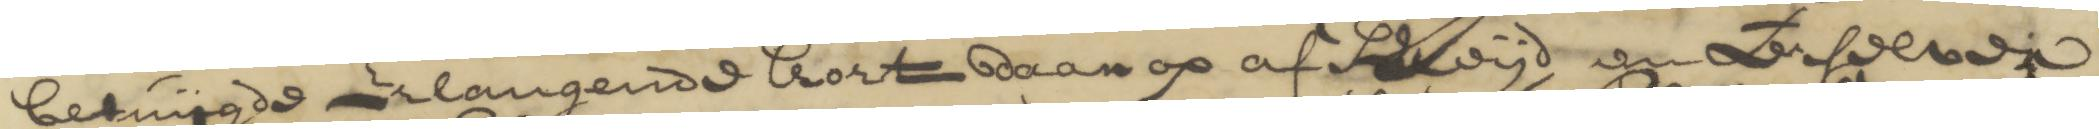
betuijgde Erlangende kort daar op afscheijd en te selver
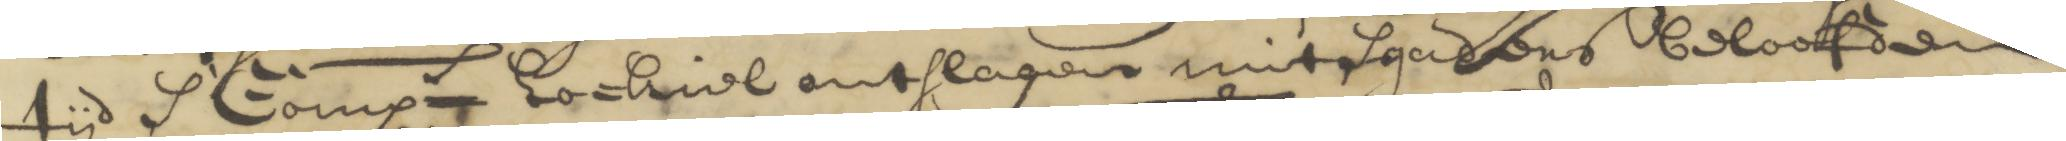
tijd ’s Comp=s hockiel ontslagen mitsgaders beloofden
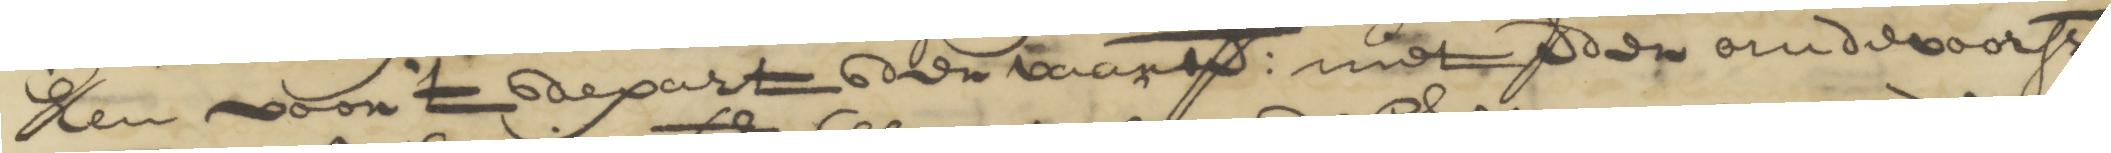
hem voor ’t depart der vaartver: niet verder om de voorsz:
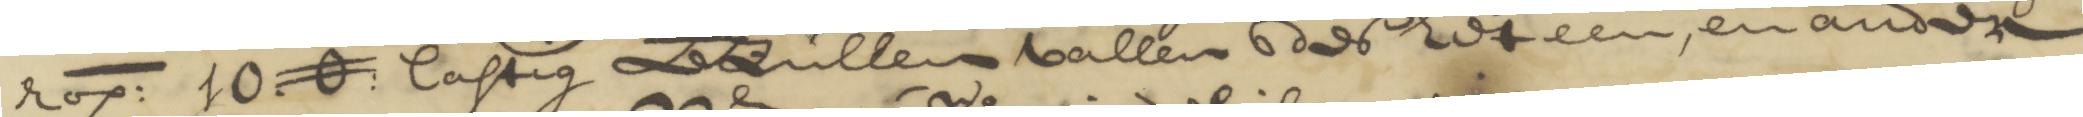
rop: 10. Ø: lastig te zullen vallen des het een, en ander
